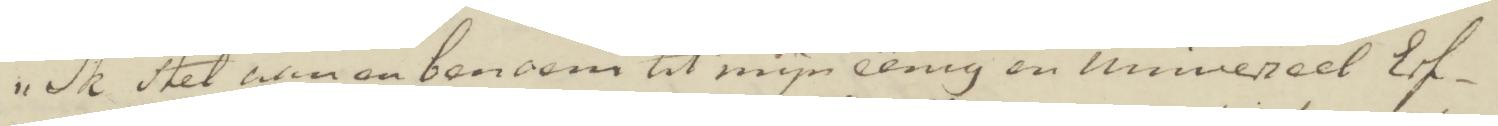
„ Ik stel aan en benoem tot mijn eenig en universeel Erf=
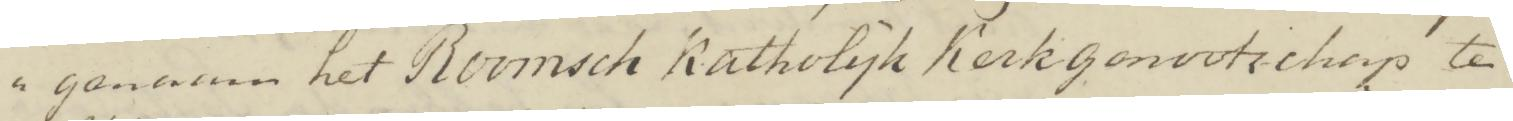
„ genaam het Roomsch Katholijk Kerk genootschap te
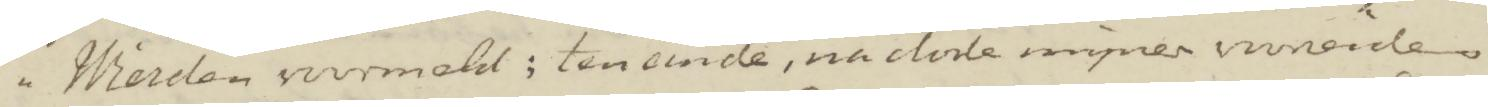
„ Wierden voormeld; ten einde, na dode mijner voorzeide
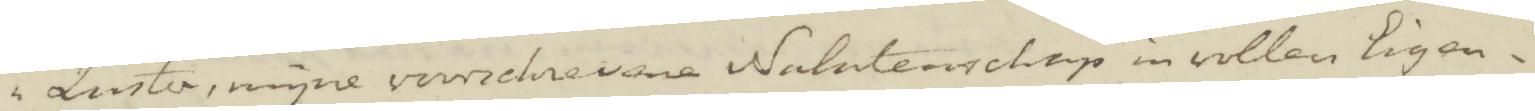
„ Zuster, mijne voorschrevene Nalatenschap in vollen Eigen„
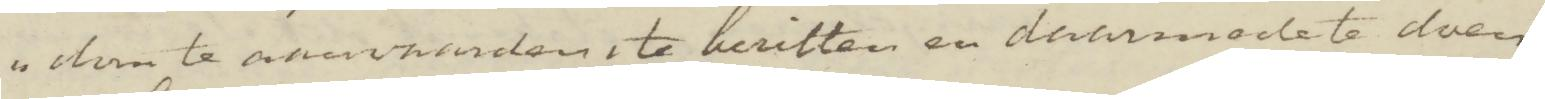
„ dom te aanvaarden, te bezitten en daarmede te doen
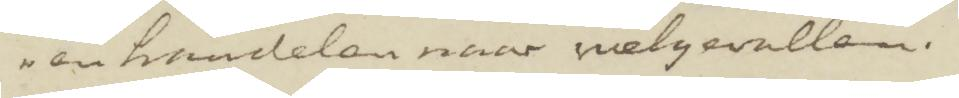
„ en handelen naar welgevallen.
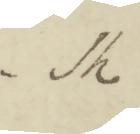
Ik
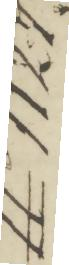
ZZ:o 1127
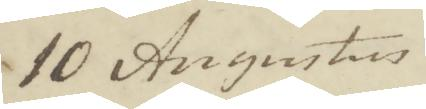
10 Augustus
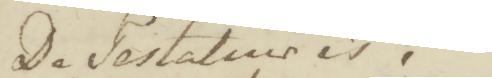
De Testateur is,
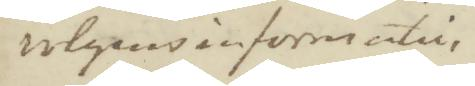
volgens in formatie,
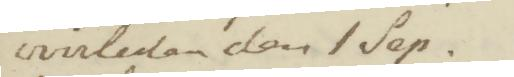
overleden den 1 Sep,
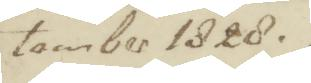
tember 1828.
